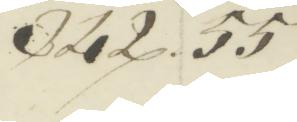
842.55
